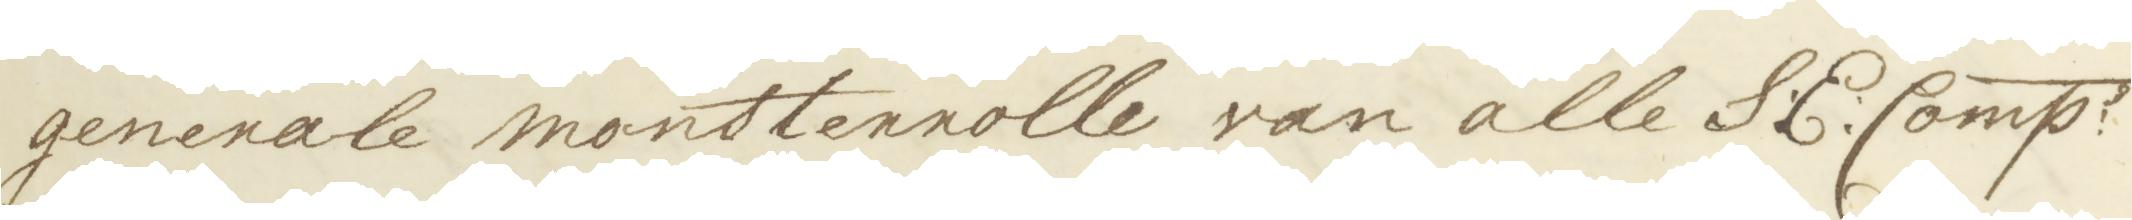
generale monsterrolle van alle S:E: Comp:s
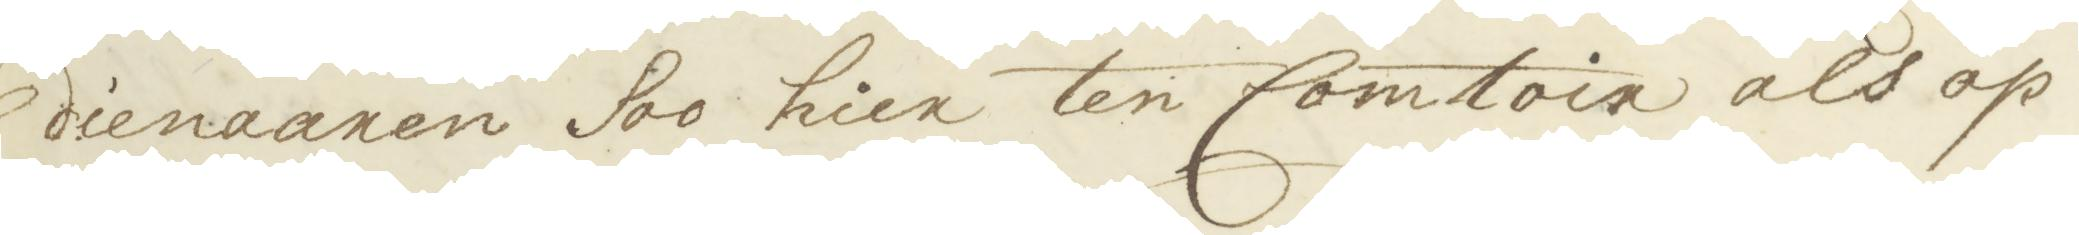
dienaaren soo hier ten Comtoir als op
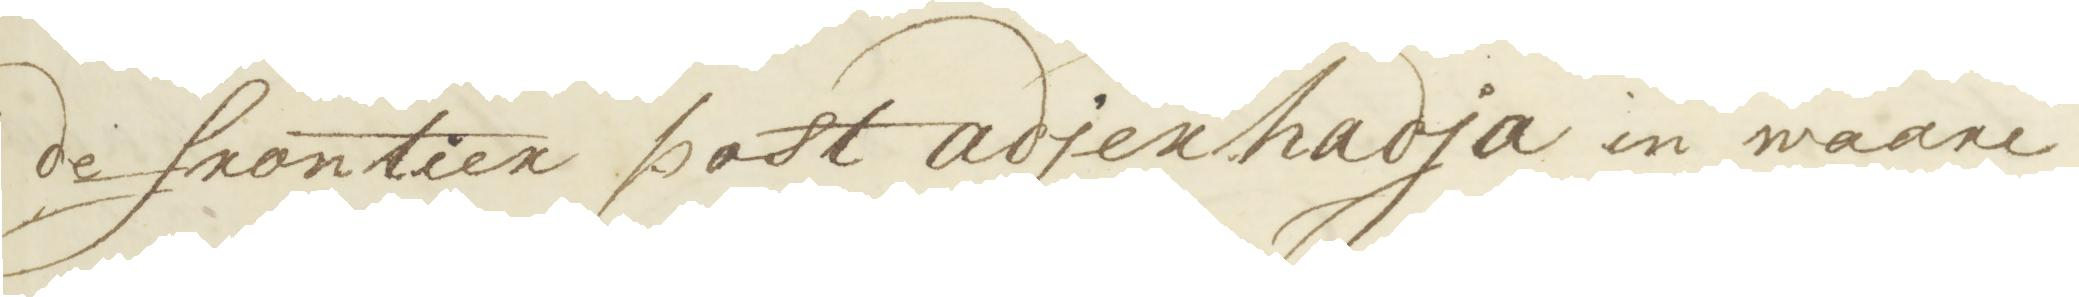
de Frontier post adjerhadja in waare
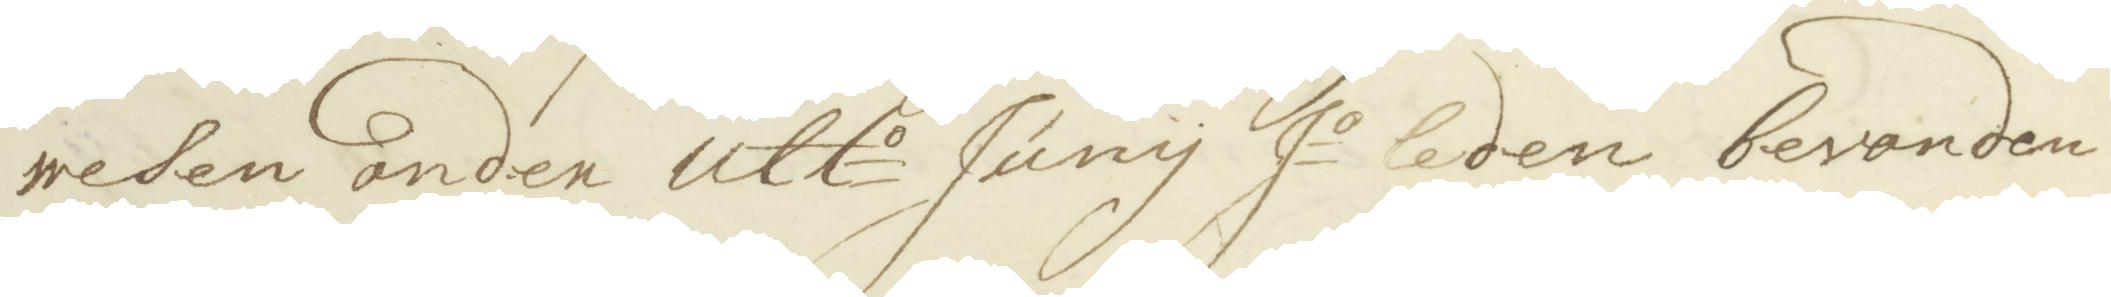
wesen onder ult=o Junij J=o leden bevonden
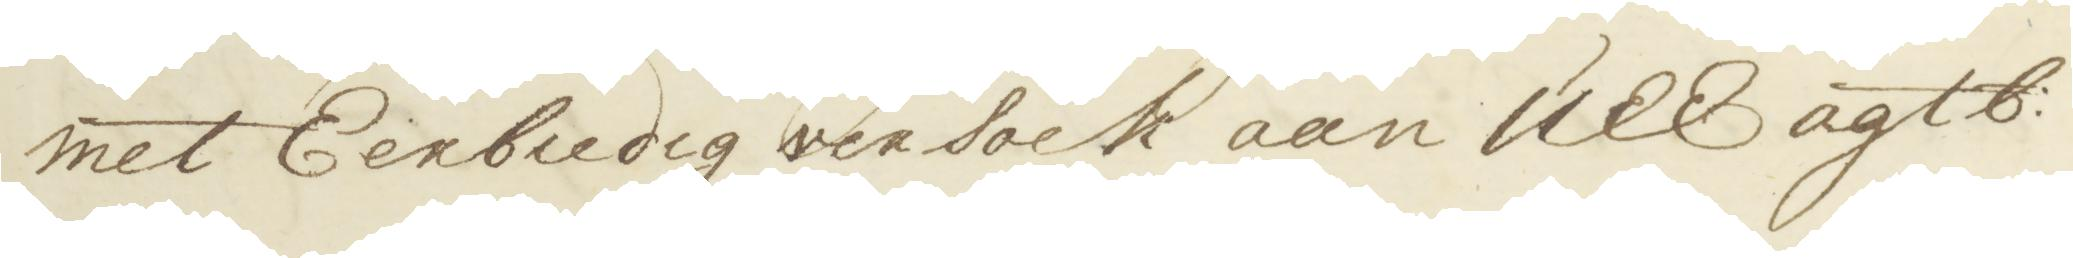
met Eerbiedig versoek aan UEE agtb:
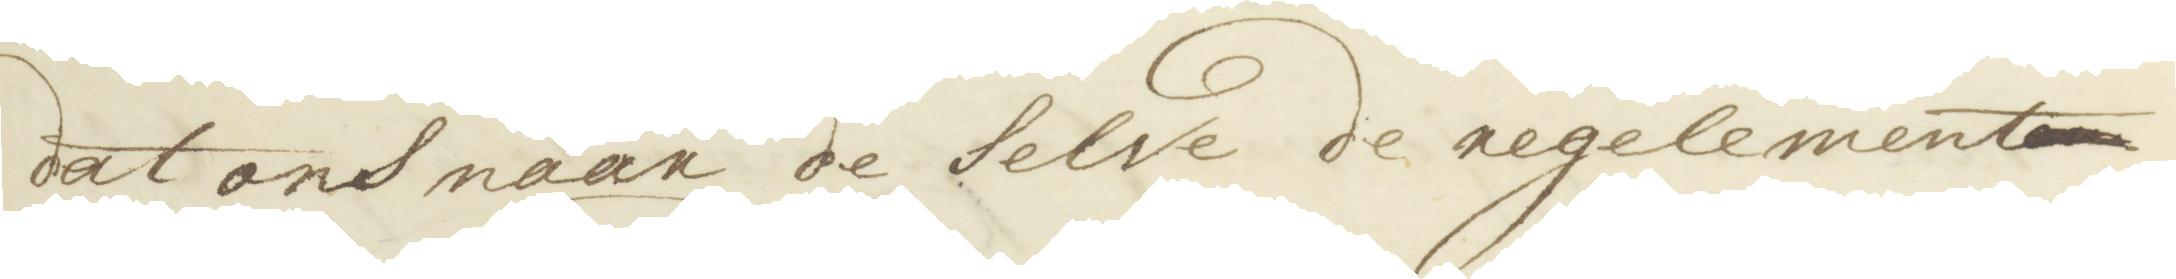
dat ons naar de selve de regelementen
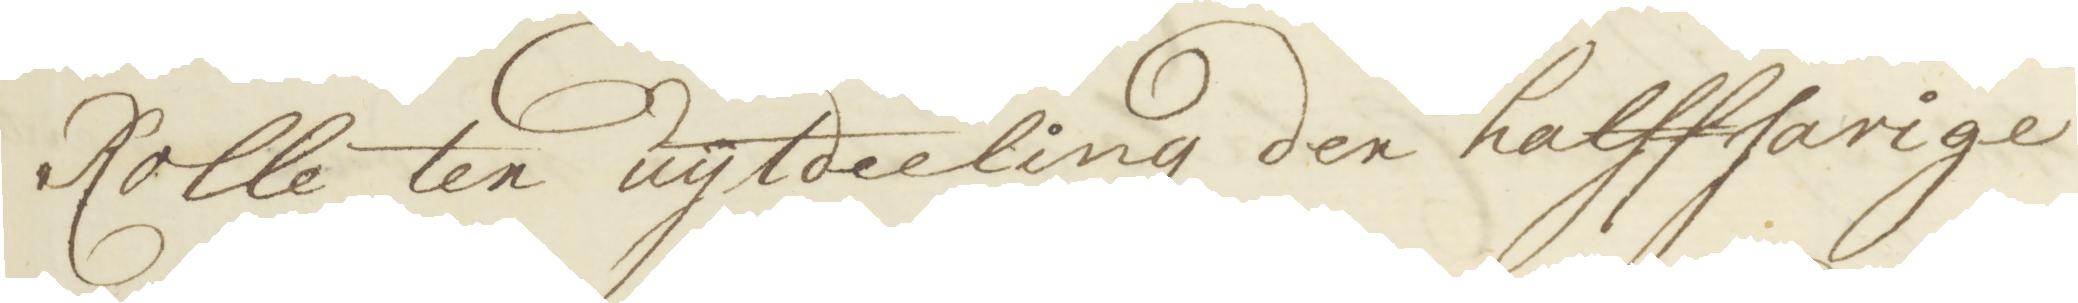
Rolle ter uijtdeeling der halffjarige
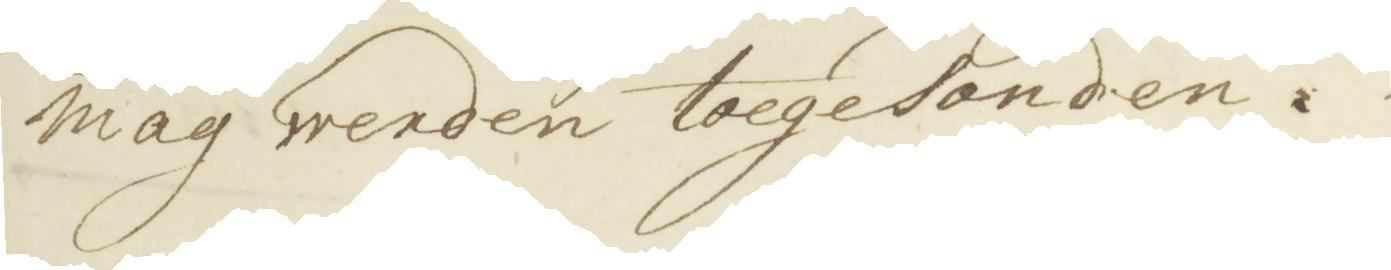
mag werden toegesonden.
